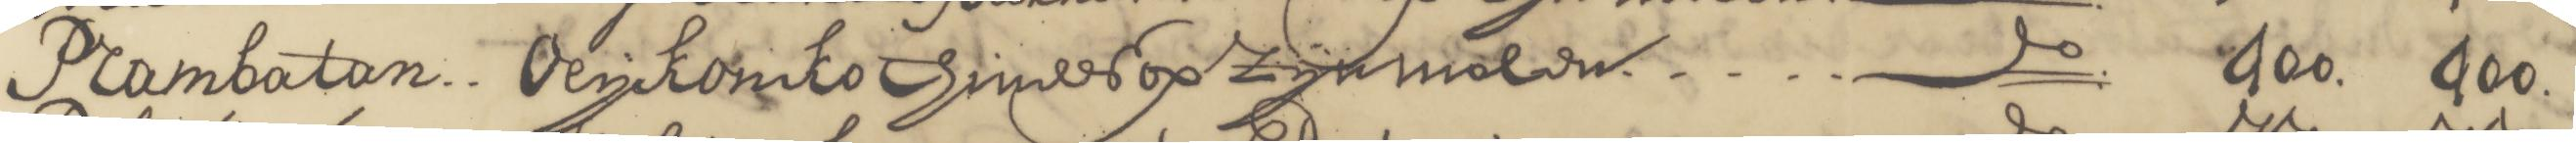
Prambatan - - Oeijkomko chinees op Zijn molen. - - - - d=o: 400. 400.
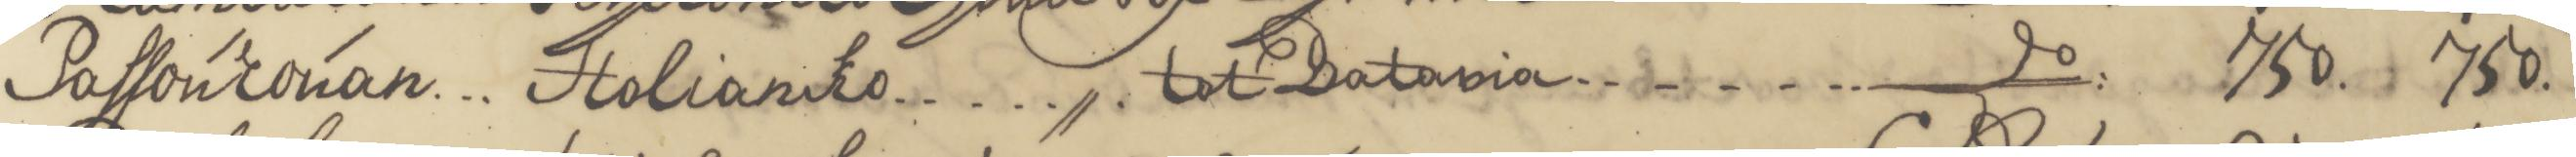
Passourouan. - -Holianko - - - - -„ . tot Batavia - - - - - - - - d=o: 750. 750.
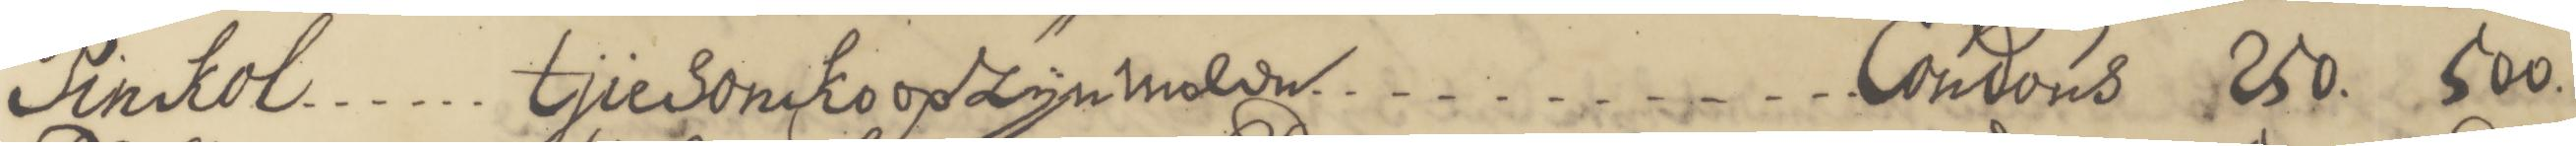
Pinkol - - - - - - tjiesonko op Zijn molen - - - - - - - - - - - - Coudous 250. 500.
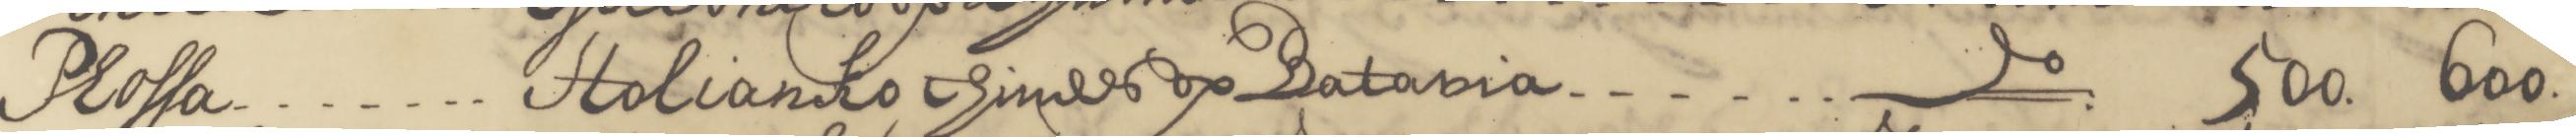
Plossa - - - - - - - Holianko, chinees op Batavia - - - - - - d=o: 500. 600.
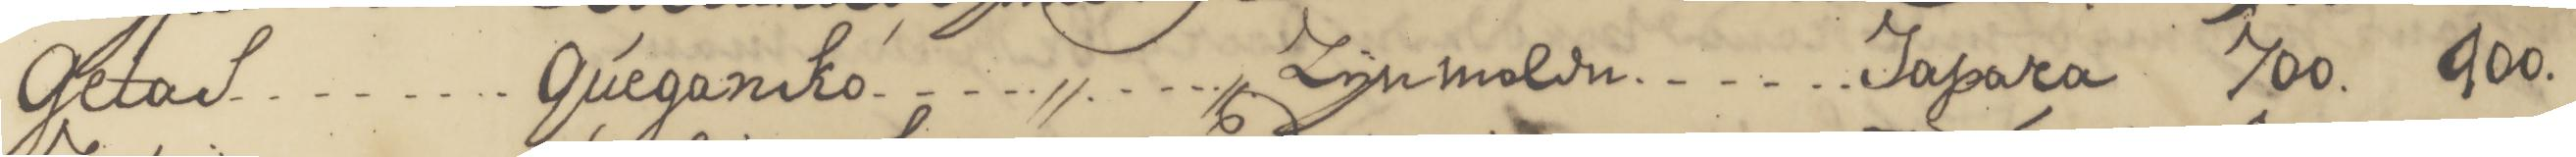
Getas - - - - - - - - queganko - - - -. „ . - - -. „ Zijn molen. - - - - - Japara 700. 400.
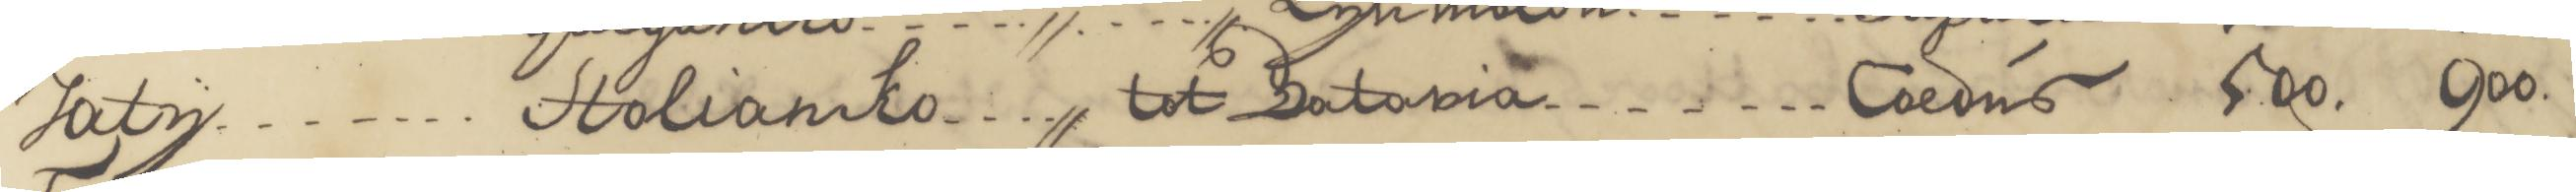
Jatij - - - - - - - . Holianko - - - - „ tot Batavia - - - - - - - Coedus 500. 900.
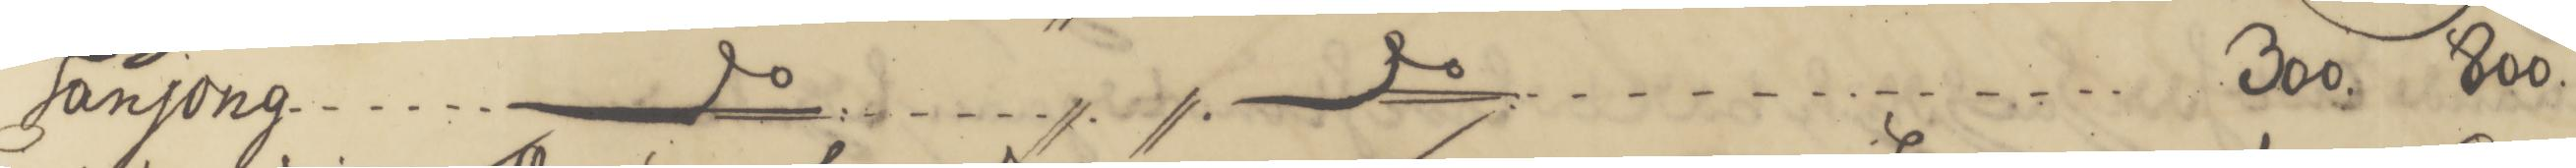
Tanjong - - - - - - d=o: - - - - - „. „ . d=o: - - - - - - - - - - - - - 300. 800.
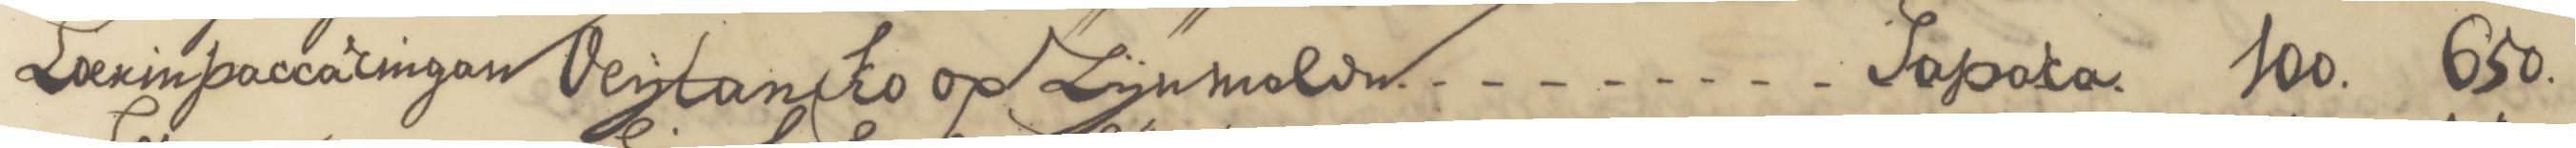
Loerinpaccaringan Oeijtaniko op Zijn molen - - - - - - - - - - Japara 100. 650.
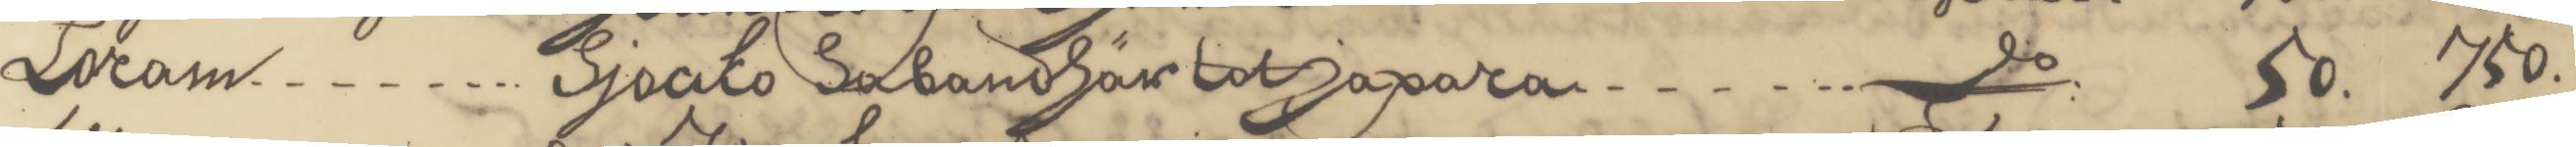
Loram - - - - - - - . Sjocko Sabandhar „ tot Japara - - - - - - d=o: 50. 750.
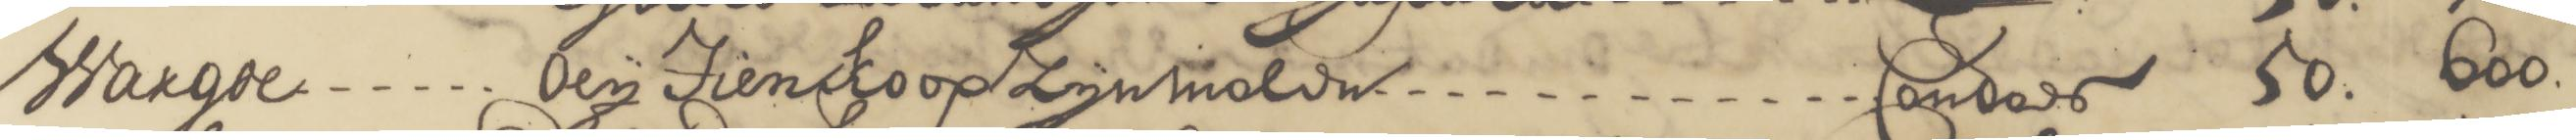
Wargoe- - - - - - Oeij Iienko op Zijn molen - - - - - - - - - - - - - Coudoes 50. 600.
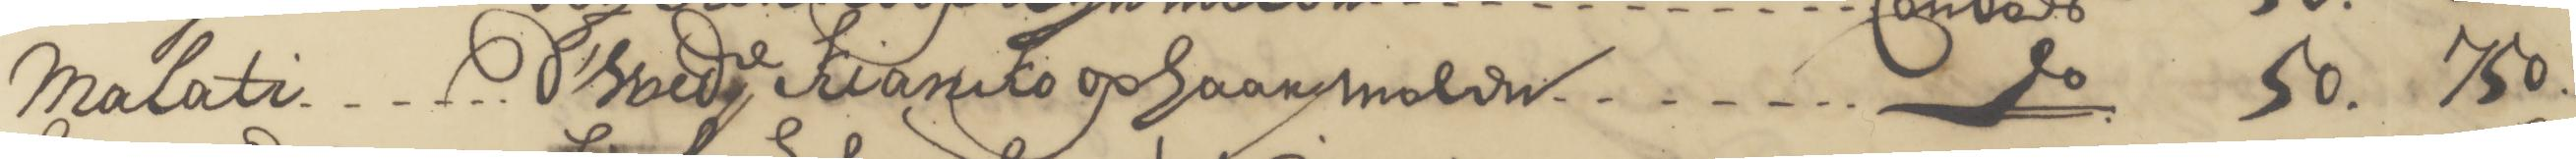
Malati - - - - - - d’Wed„e kianiko op haar molen - - - - - - - d=o: 50. 750.
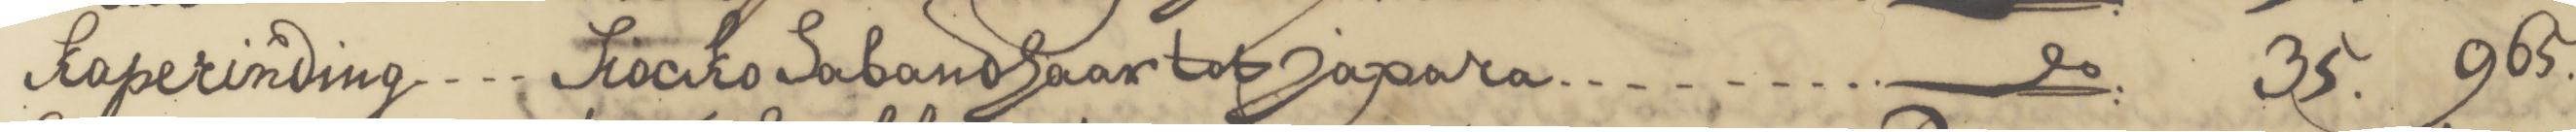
kaperinding- - - -Siocko Sabandhaar tot Japara - - - - - - - - - - d=o: 35. 965.
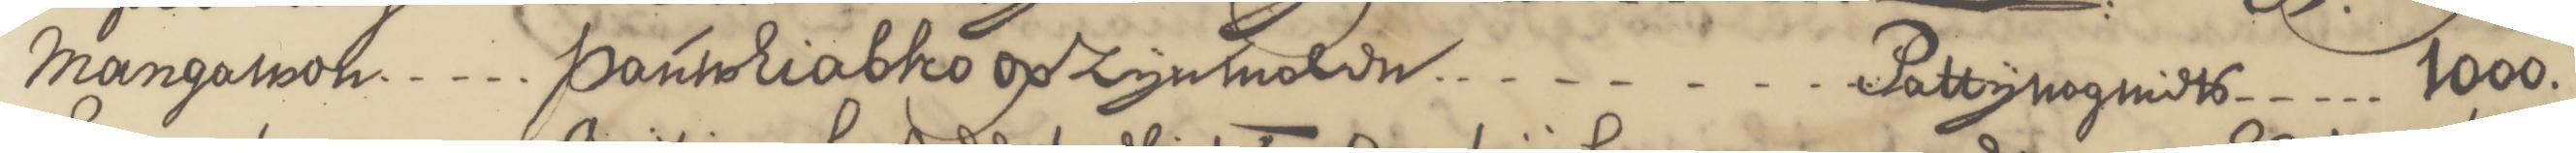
mangawon- - - - - pauwhiabko op Zijn molen - - - - - - - - Pattij nog niets - - - - - 1000.
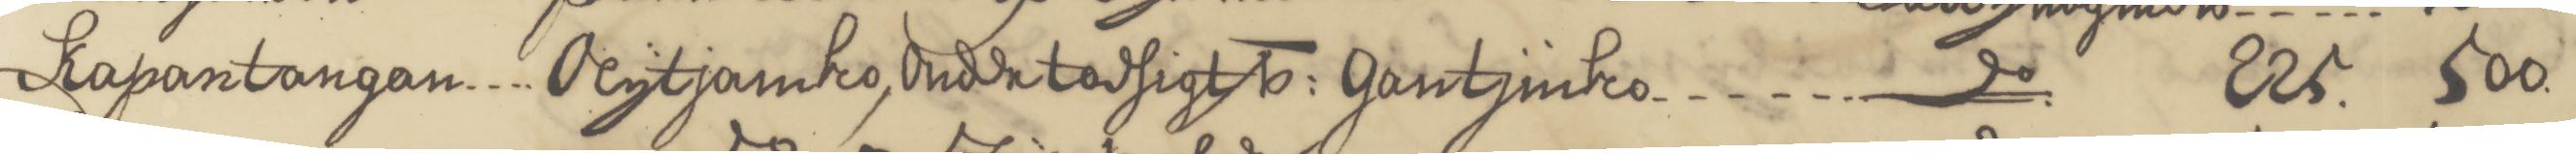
kapantangan - - -. Oeijtjamko, onder toesigt v: gantjinko - - - - - - - d=o: 225. 500.
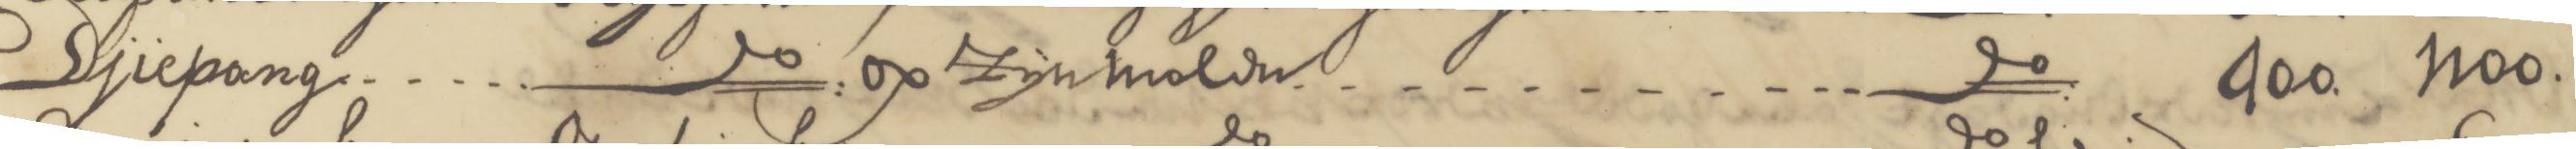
Djiepang- - - - - - d=o: op Zijn molen- - - - - - - - - - - - d=o: 400. 1100.
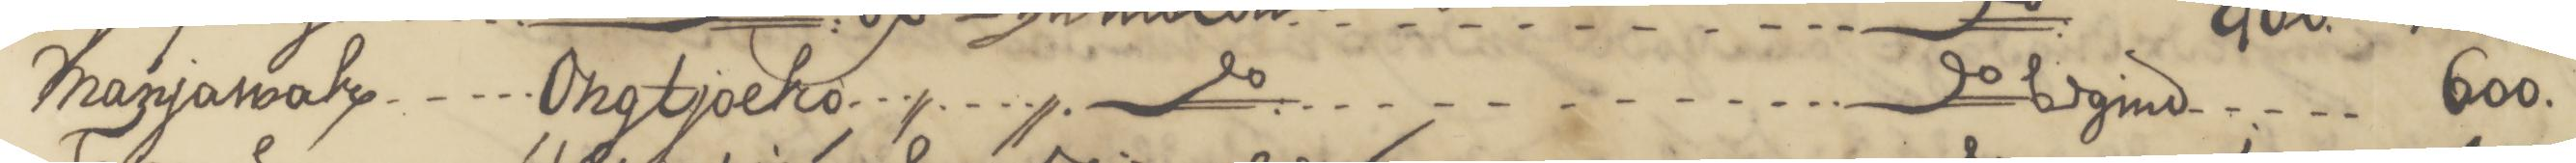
Manjawak - - - - - Ongtjoeko - - - „ - - - „. d=o:- - - - - - - - - - - - - - - d=o begind - - - - - 600.
